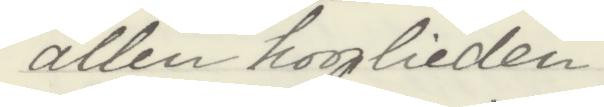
allen kooplieden
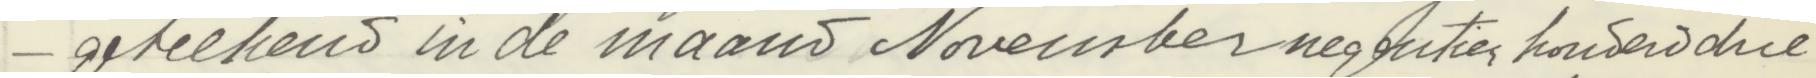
— geteekend in de maand November negentien honderd drie
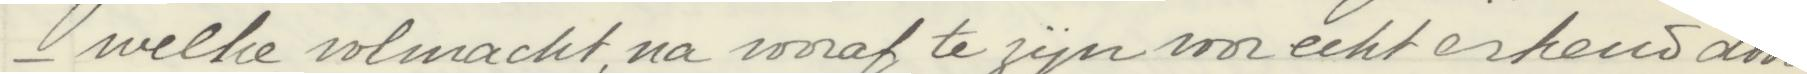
— welke volmacht, na vooraf te zijn voor echt erkend door
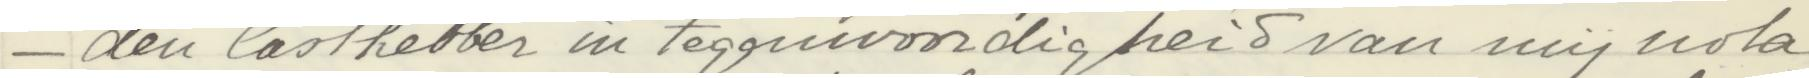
— den lasthebber in tegenwoordigheid van mij nota
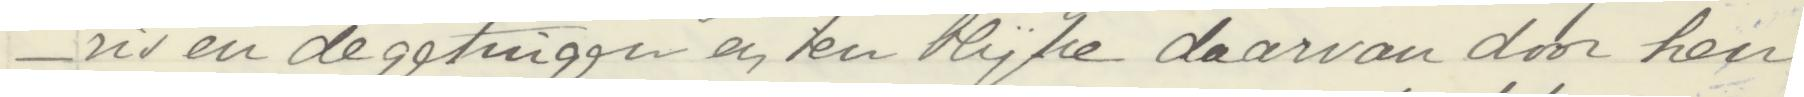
— ris en de getuigen en ten blijke daarvan door hen
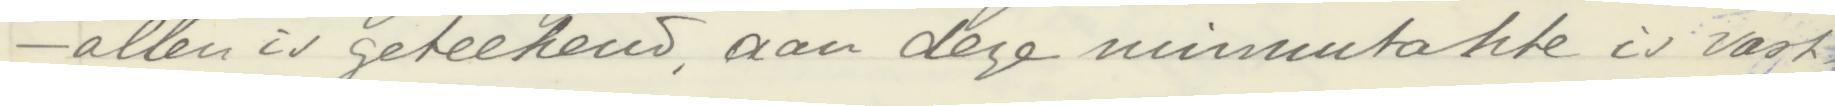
— allen is geteekend, aan deze minuutakte is vast
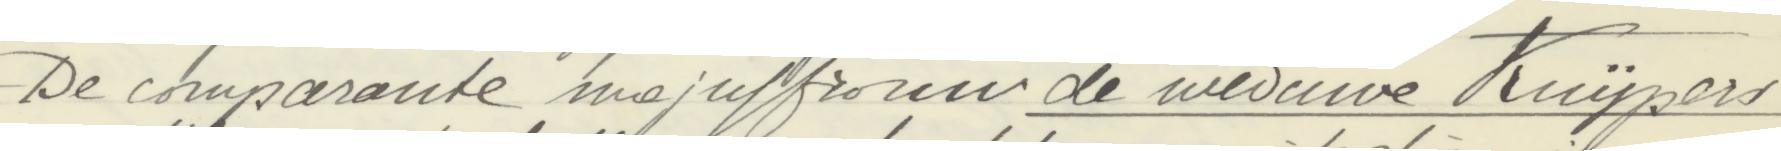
De comparante mejuffrouw de weduwe Kuijpers
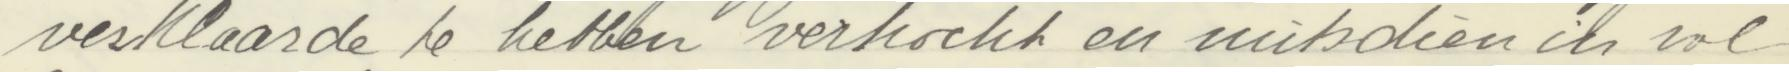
verklaarde te hebben verkocht en mitsdien in vol
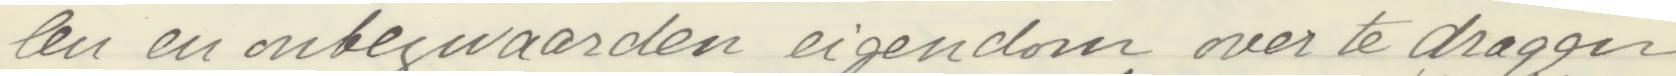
len en onbezwaarden eigendom over te dragen
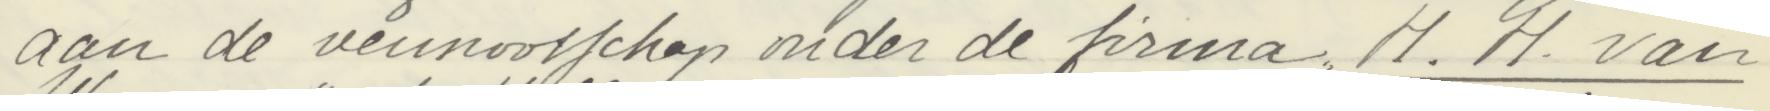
aan de vennootschap onder de firma „ H. H. van
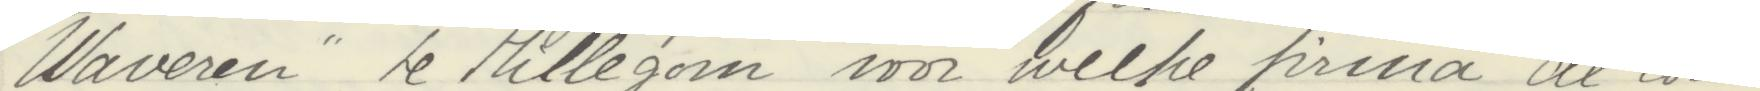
Waveren " te Hillegom, voor welke firma de com
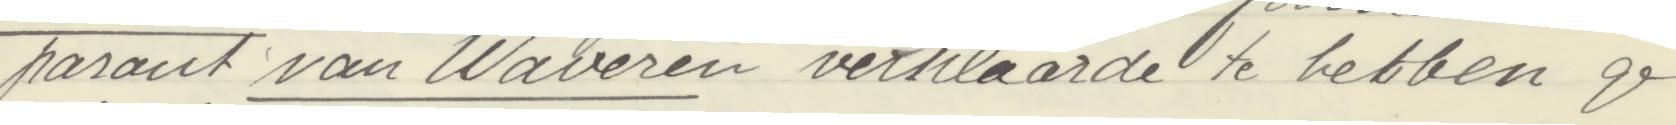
parant van Waveren verklaarde te hebben ge
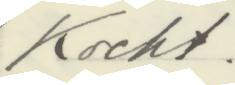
kocht
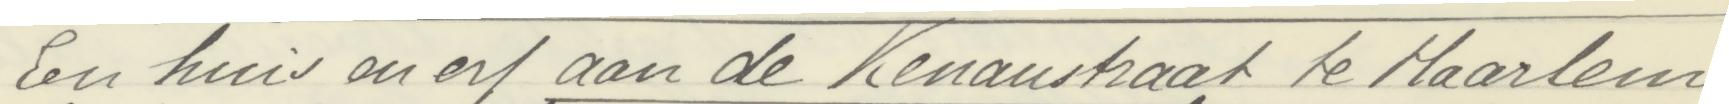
Een huis en erf aan de Kenaustraat te Haarlem
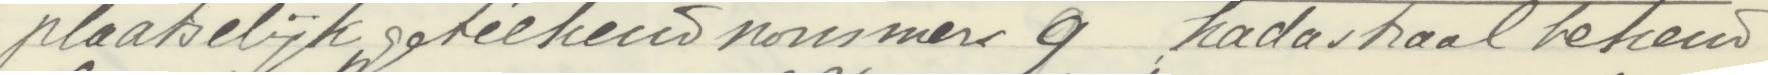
plaatselijk geteekend nommer 9 kadastraal bekend
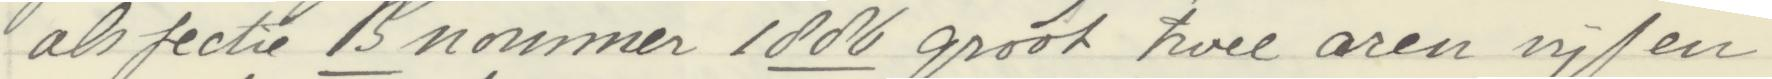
als sectie B nommer 1886 groot twee aren vijf en
